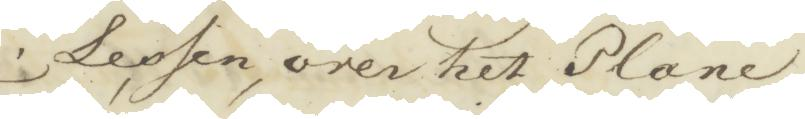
Lessen, over het Plane
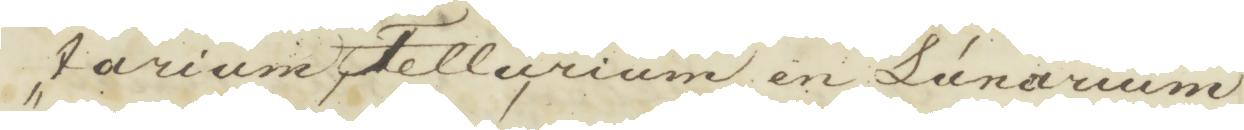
„tarium Tellurium en Lunarium
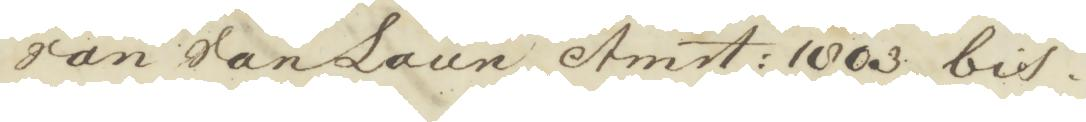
van van Laun Amst: 1803, bis.
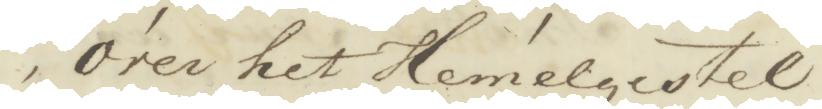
, over het Hemelgestel
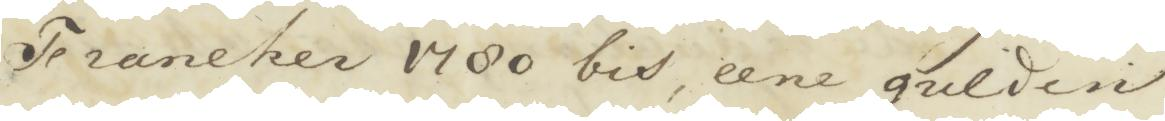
Franeker 1780 bis, eene gulden
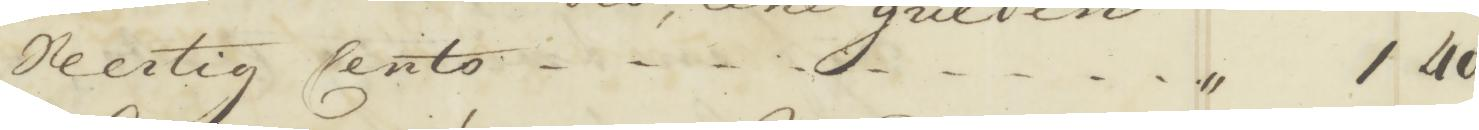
Veertig cents - - - - - - - - - „ 1 40
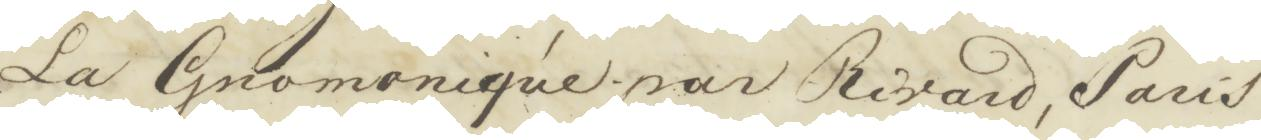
La Gnomonique par Rivard, Paris
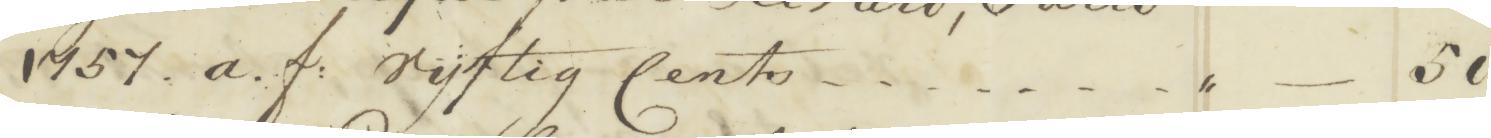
1757. a. f: vijftig cents - - - - - - - „ — 50
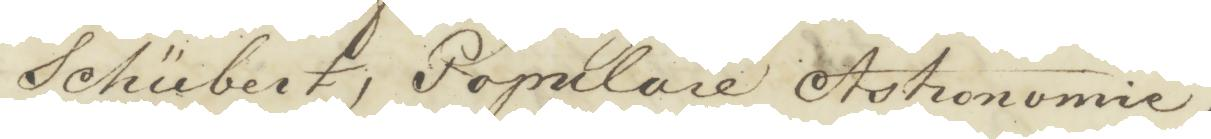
Schübert, Populare Astronomie
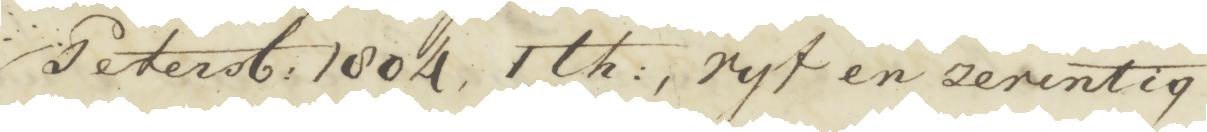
Petersb: 1804, 1th:, vyf en zeventig
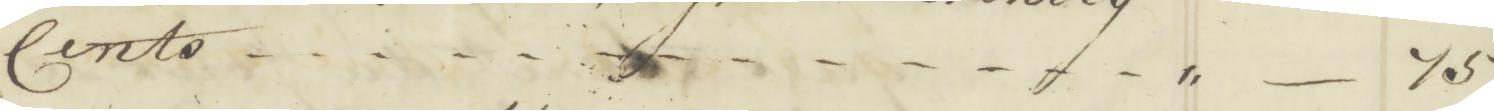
cents - - - - - - - - - - - - - „ — 75
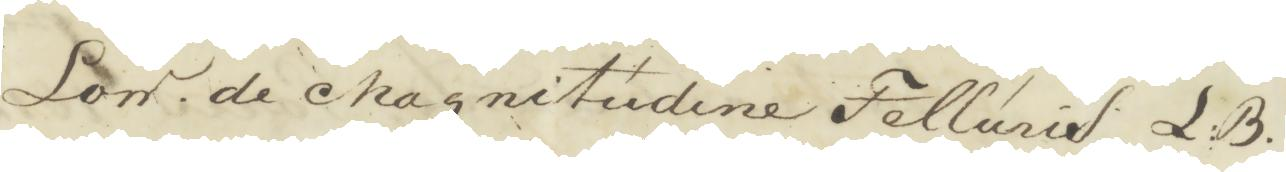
Low. de magnitudine Telluris, L:B.
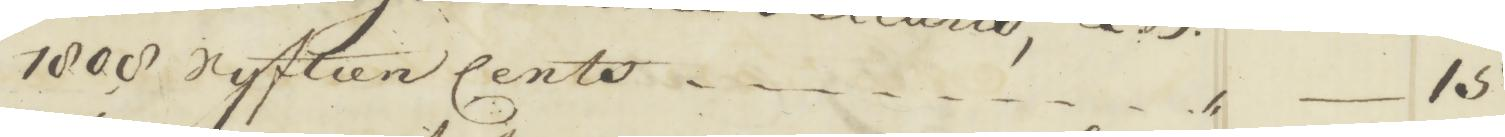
1808 vyftien cents - - - - - - - - „ — 15
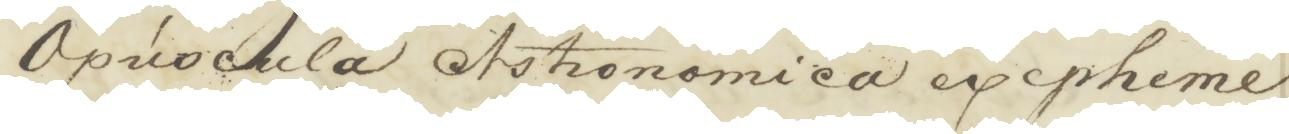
Opuscula Astronomica exepheme
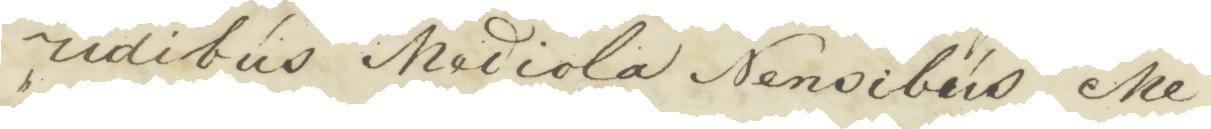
„ridibus Mediola Nensibus, Me
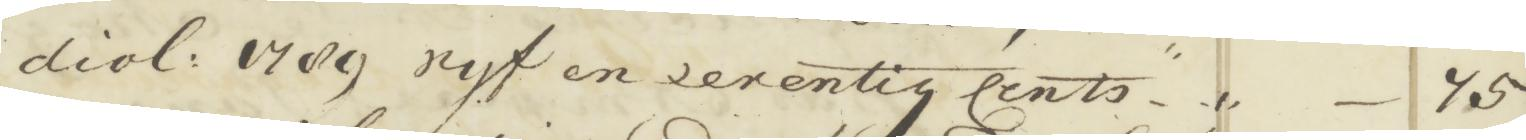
diol: 1789 vyf en zeventig cents - „ — 75
